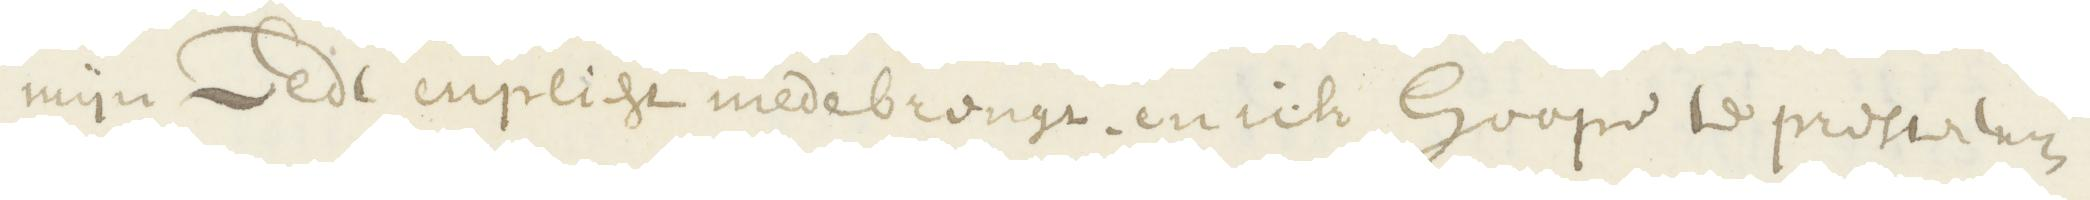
mijn eedt en plicht medebrengt. en ick Hoope te presteeren
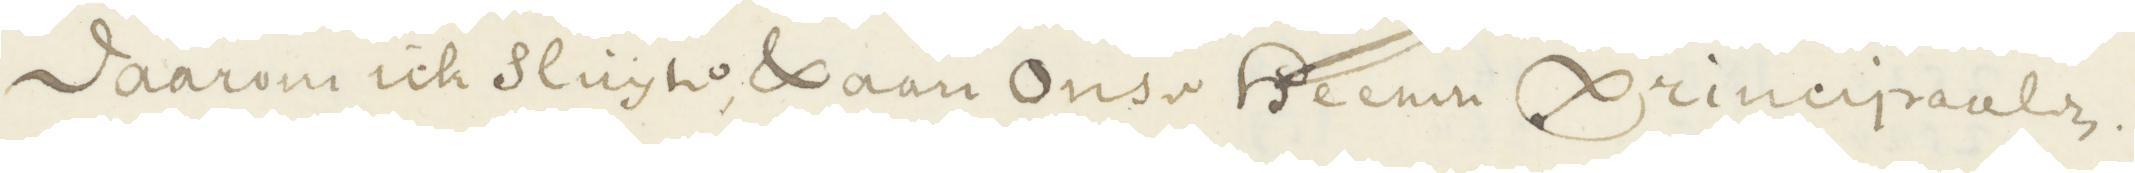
daarom ick sluijte, ende aan Onse Heeren Principaalen
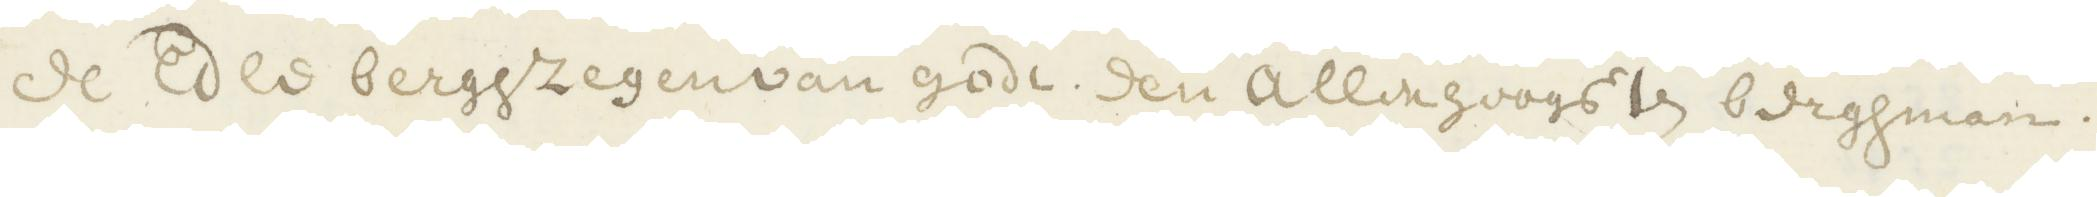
de Edle berghzegen van godt. den allerhoogsten berghman.
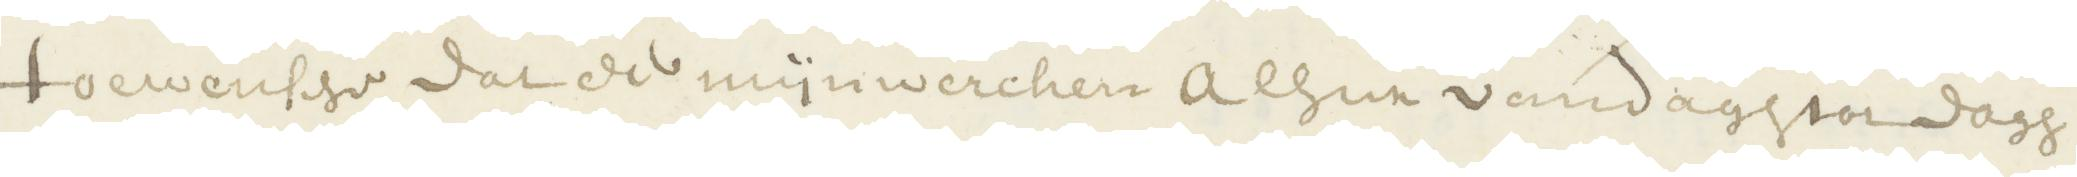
toewensche dat de mijnwercken alhier van dagh tot dagh
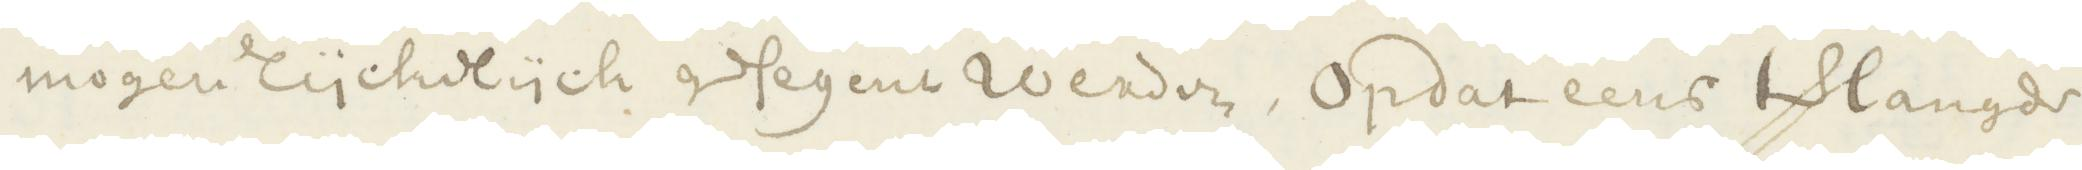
mogen rijckelijck gesegent werden, Opdat eens tverlangde
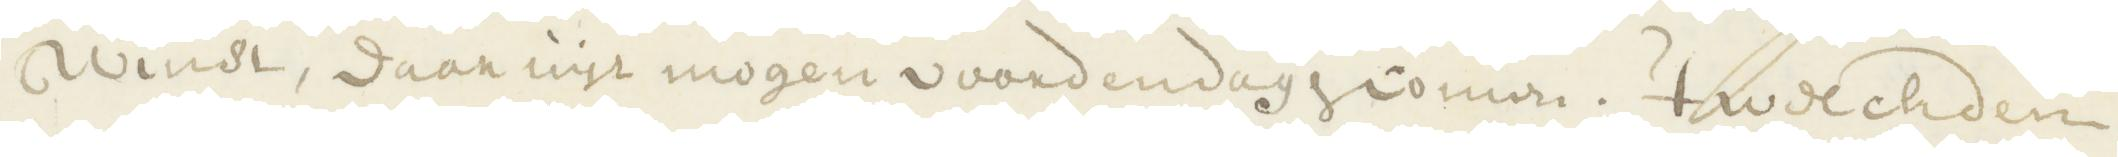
winst, daar uijt mogen voorden dagh comen. 't welck den
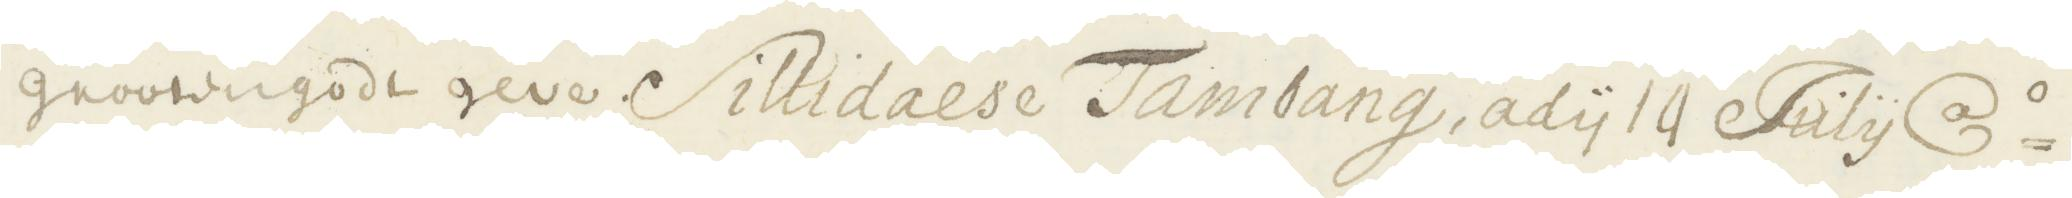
grooten godt geve. Sillidaese Tambang, adij 14 Julij a=o
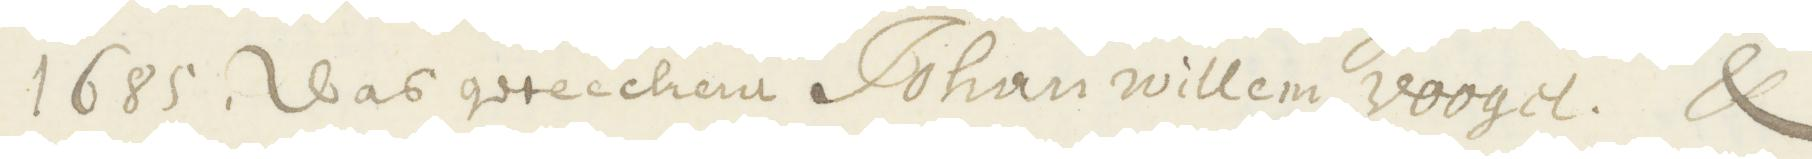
1685. Was geteeckent Johan willem vooget. &
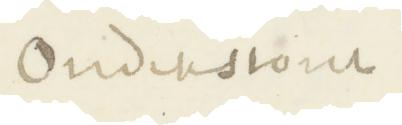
Onderstont
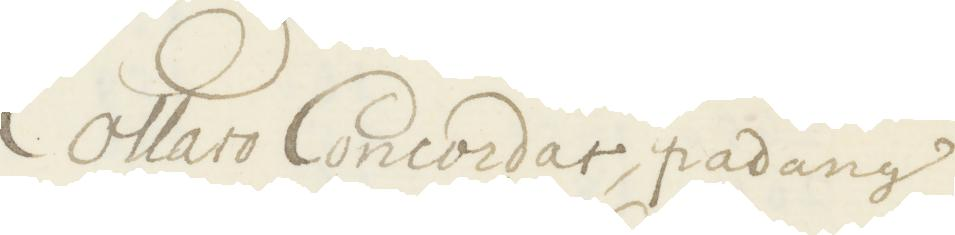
Collato Concordat, padang
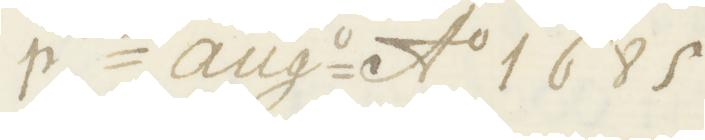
p=mo aug=o Ao 1685
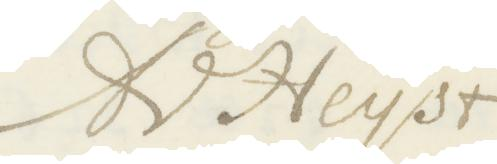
Ad Heijst
